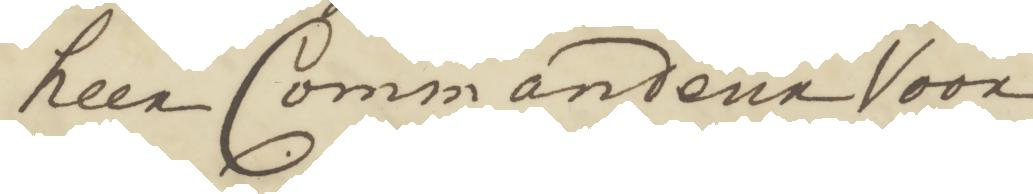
heer Commandeur voor
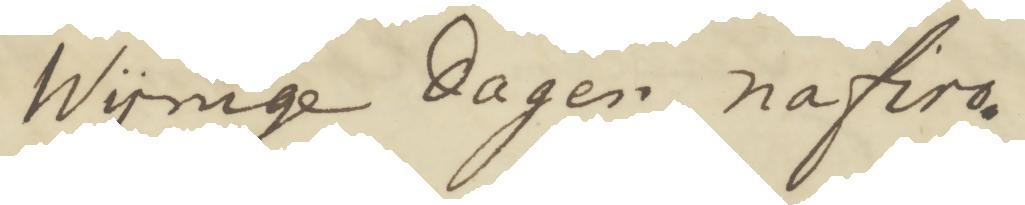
wijnige dagen na firo„
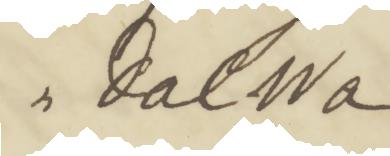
„ dalwa
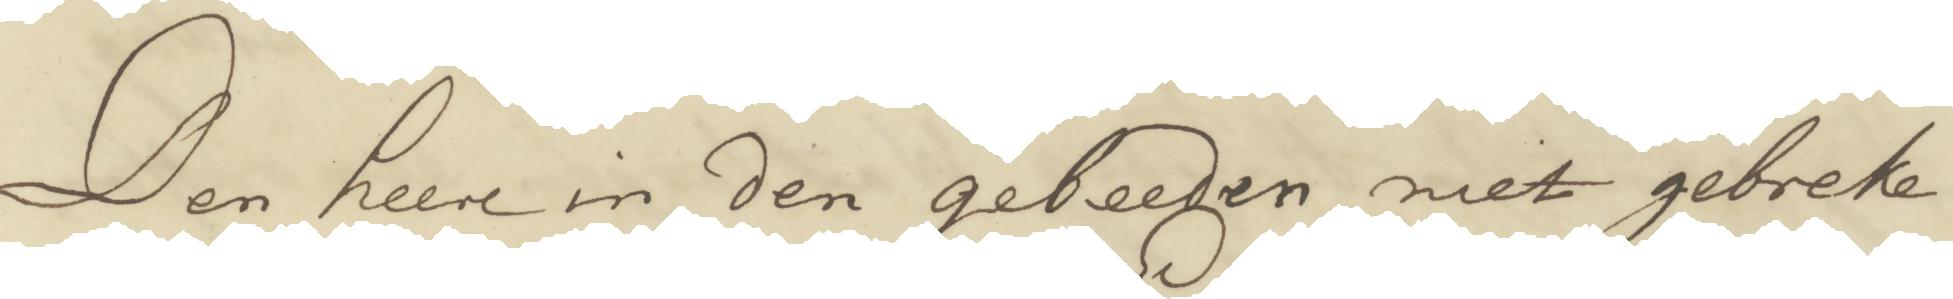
Den heer in den gebeeden niet gebreke
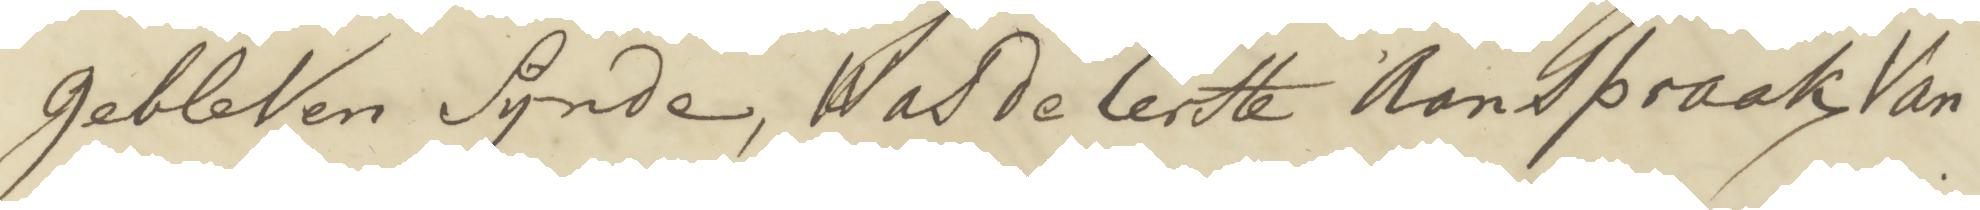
gebleven sijnde, was de Eerste Aanspraak van
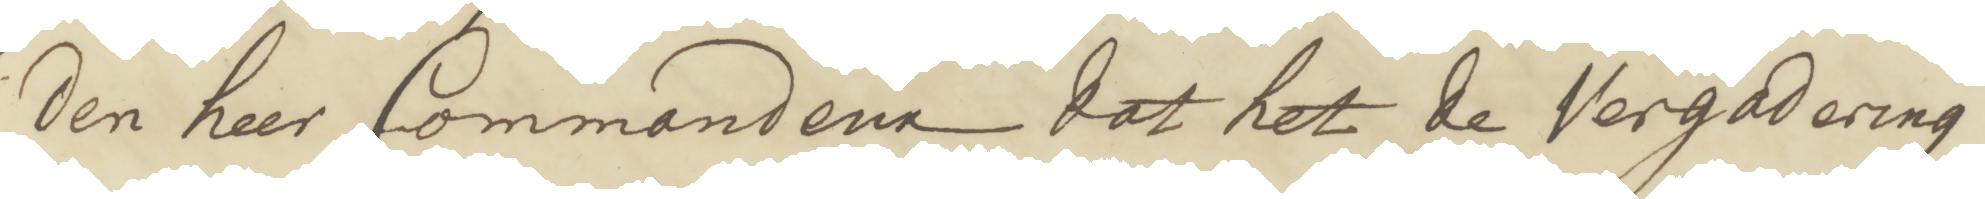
den heer Commandeur dat het de vergadering
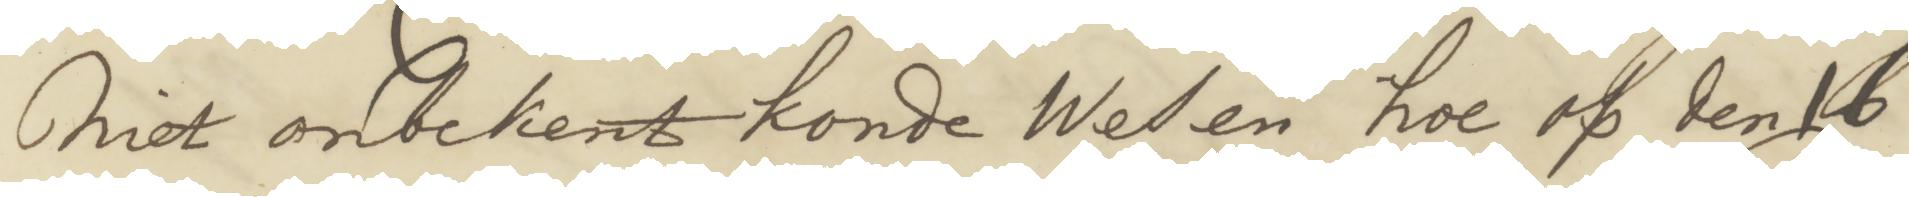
niet onbekent konde wesen hoe op den 16
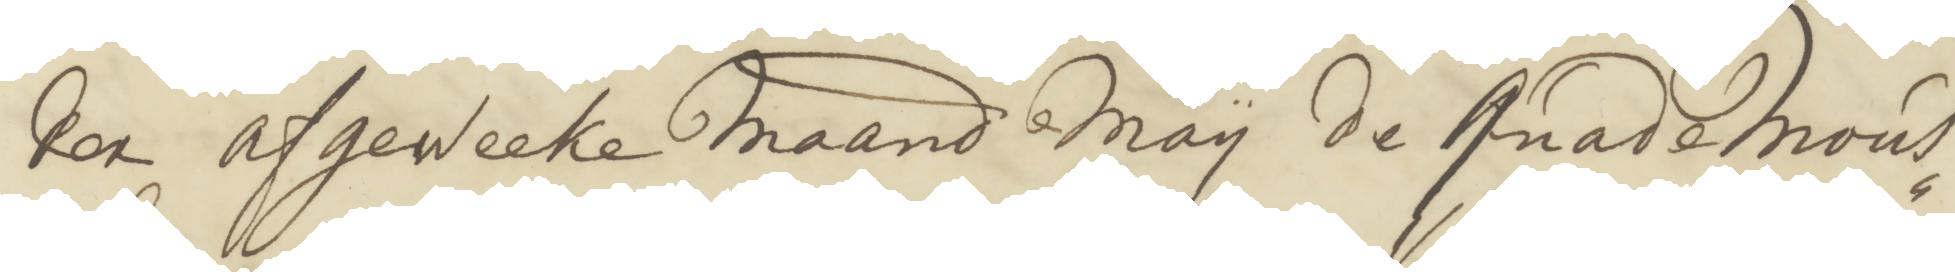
der afgeweeke maand maij de quade mous„
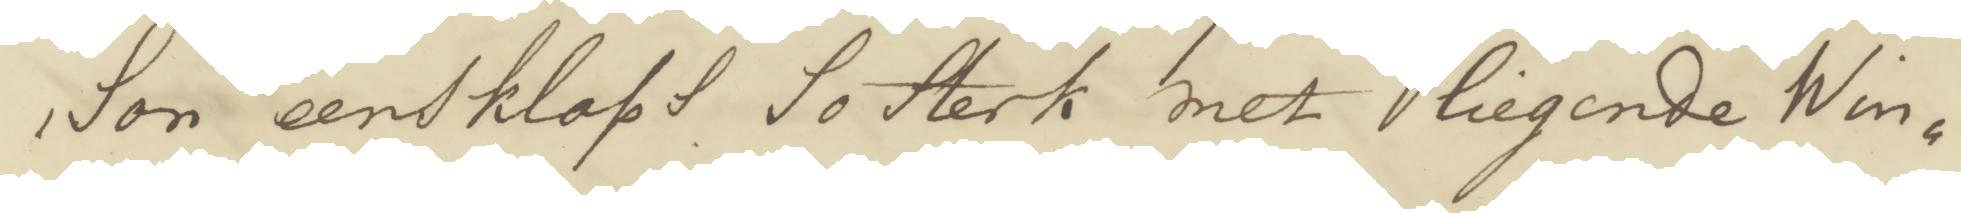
„son eensklaps so sterk met vliegende win„
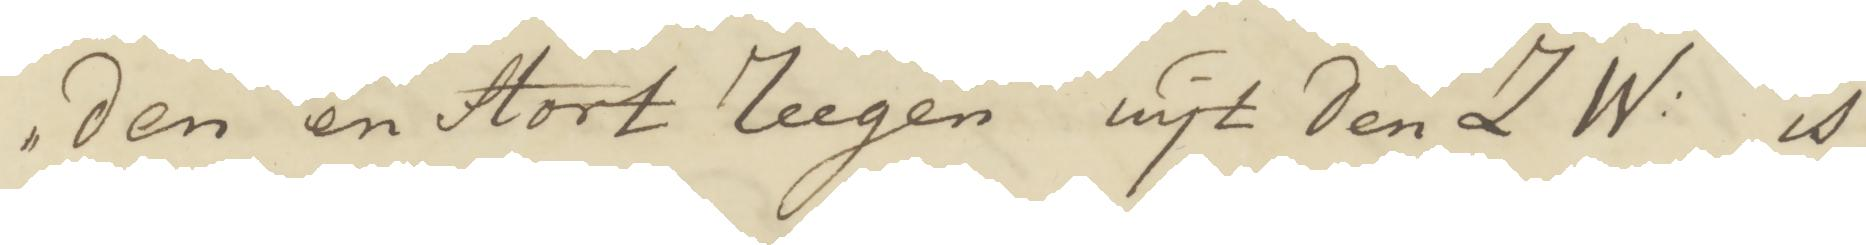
„den en stort reegen uijt den ZW: is
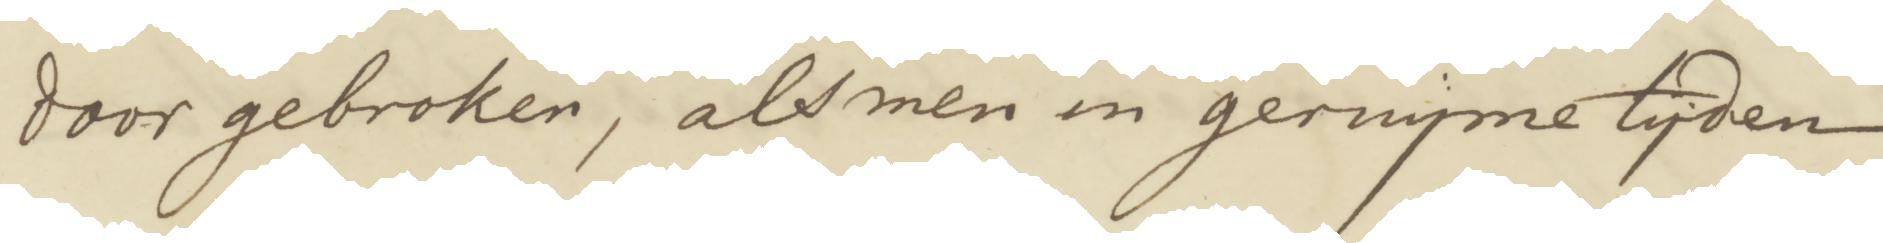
door gebroken, als men in geruijme tijden
